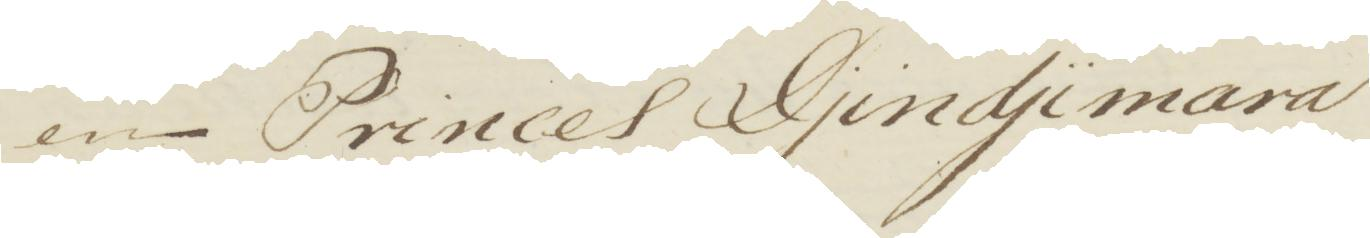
en Princes Djindjimara
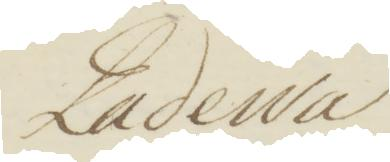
Ladewa
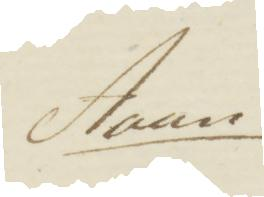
Aaan
